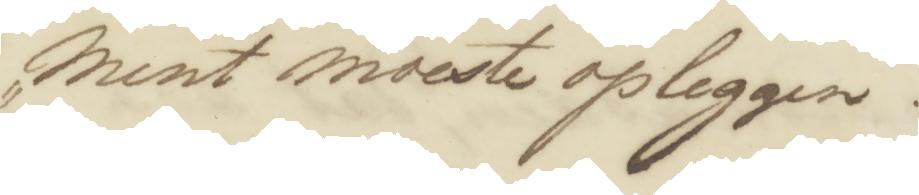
„ment moeste op leggen . . . . . . . . „ 13'308: 11 –
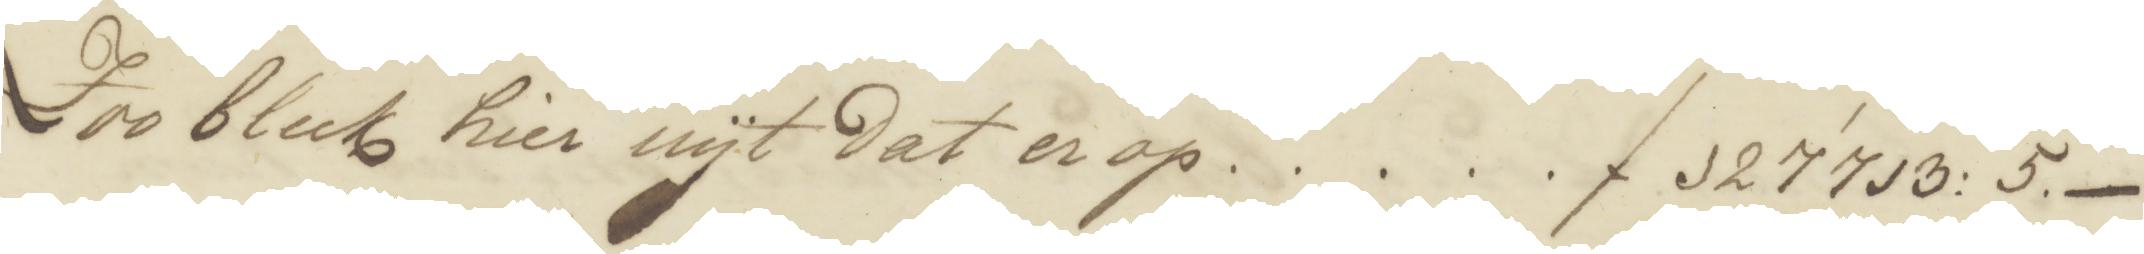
Zoo bleek hier uijt dat er op . . . . . ƒ 127'713: 5.—
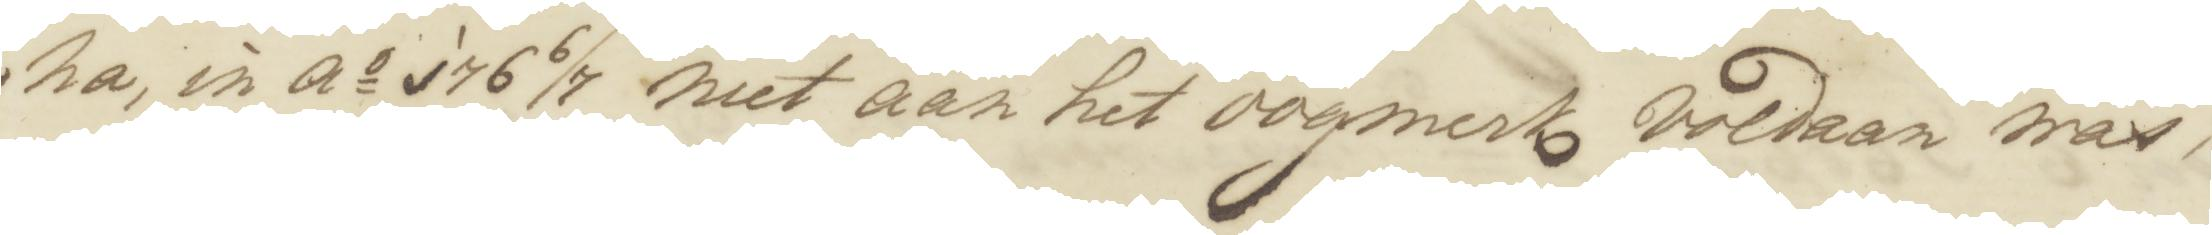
na, in A=o 176 6/7 niet aan het oogmerk voldaan was,
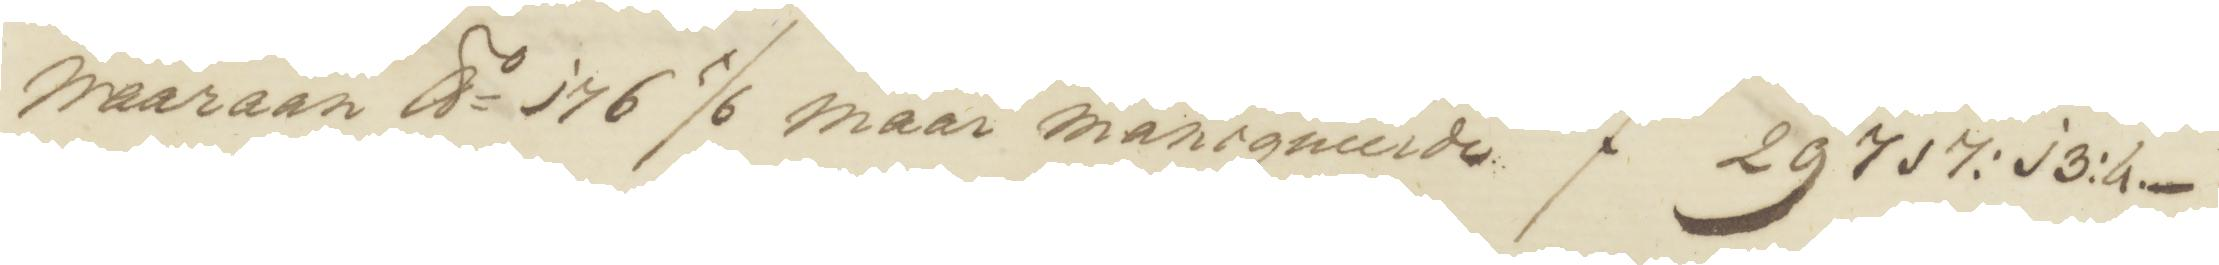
waaraan A=o 176 5/6 maar mancqueerde. ƒ 29'717: 13: 4.—
